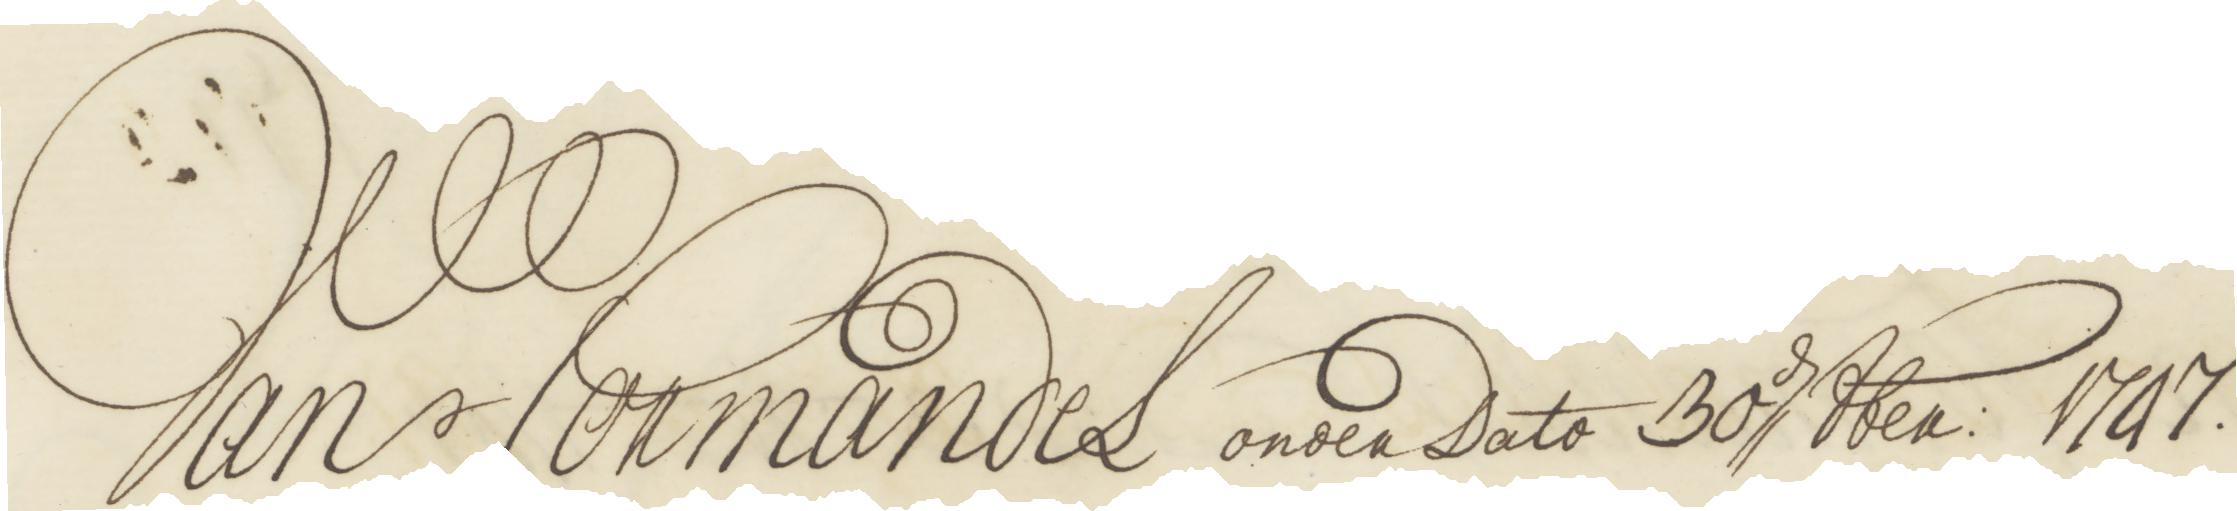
Van Cormandel onder Dato 30„en 8ber: 1747.
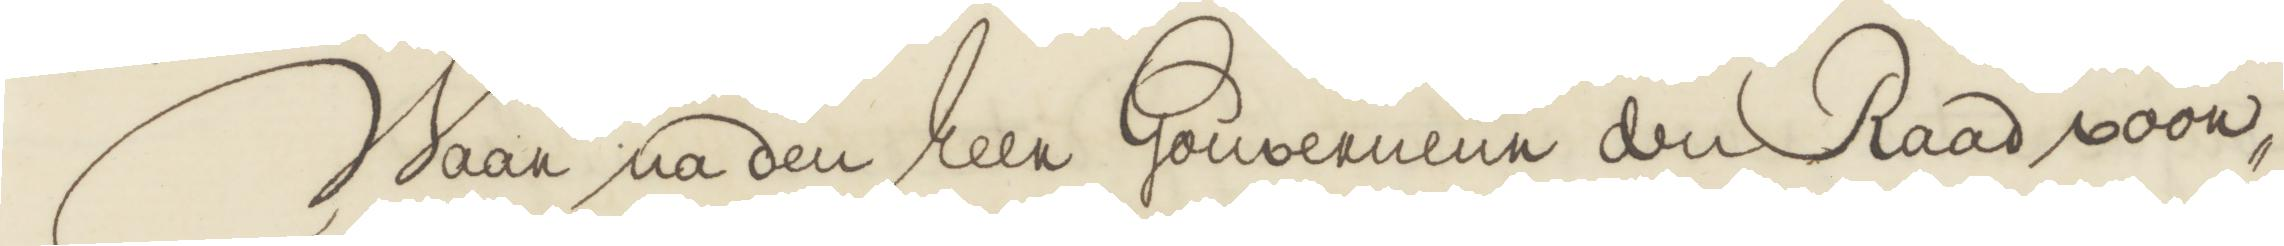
Waar na den heer Gouverneur den Raad voor„
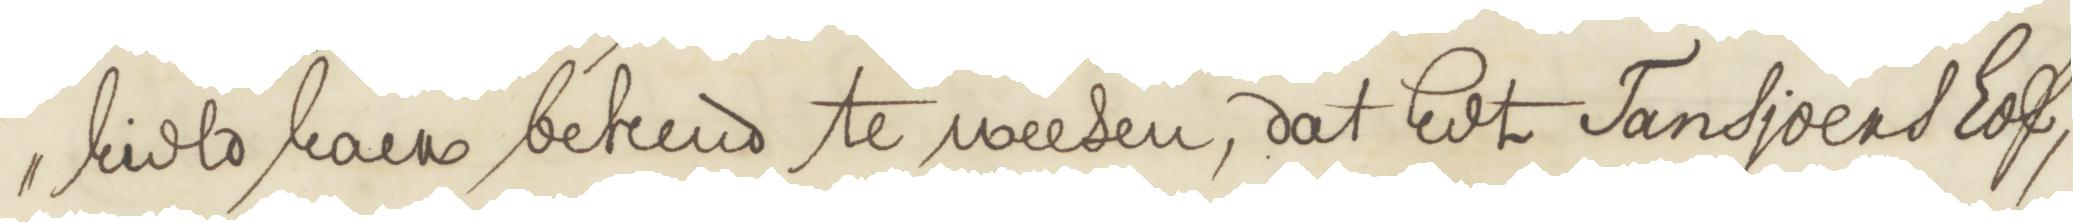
„ hield haer bekend te weesen, dat het Tansjoers hof,
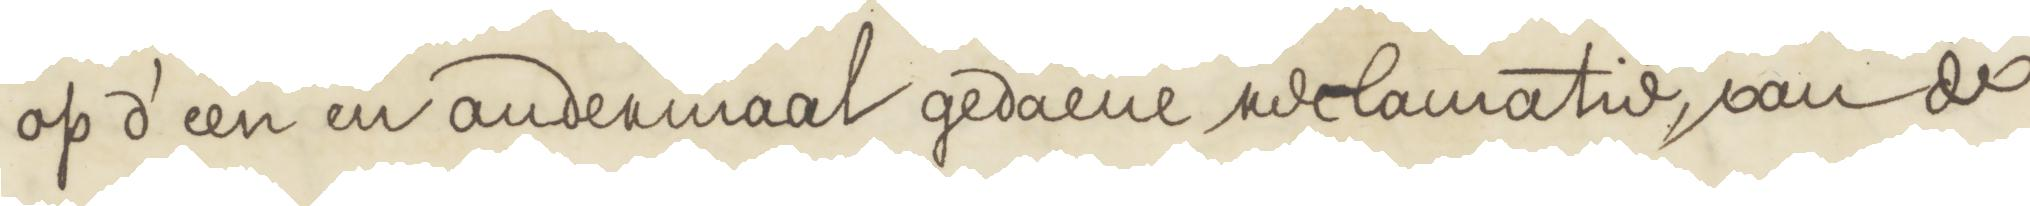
op d’ een en andermaal gedaene reclamatie, van de
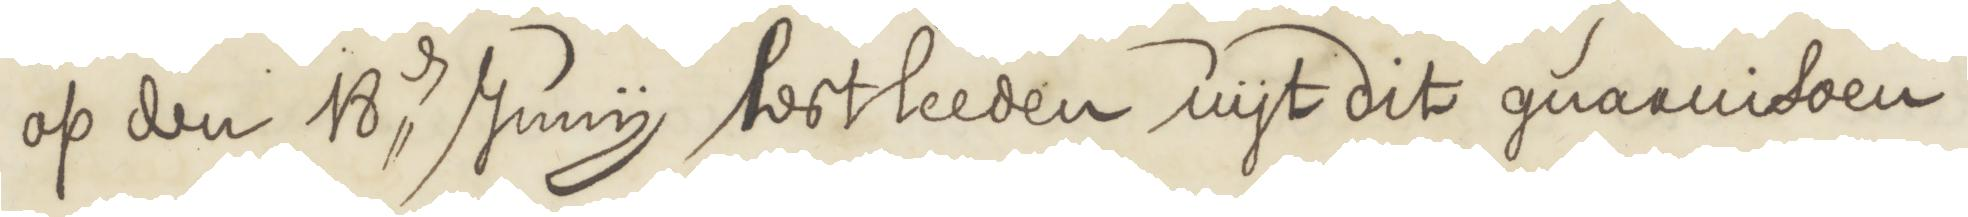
op den 18„en Junij lestleeden uijt dit guarnisoen
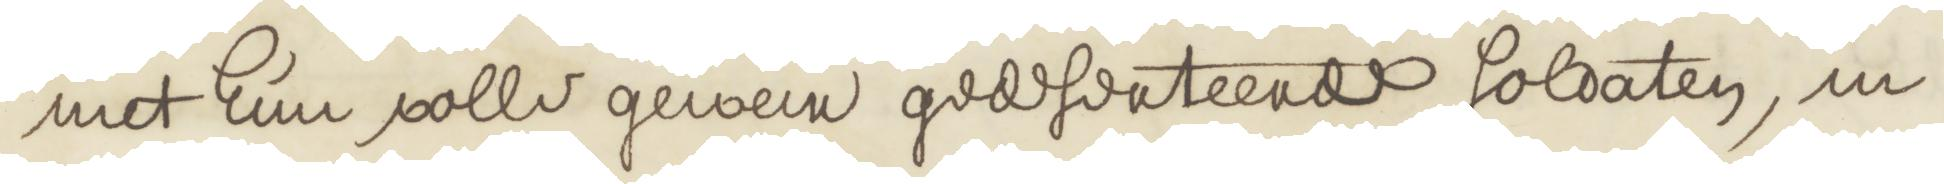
met hun volle geweir gedeserteerde soldaten, in
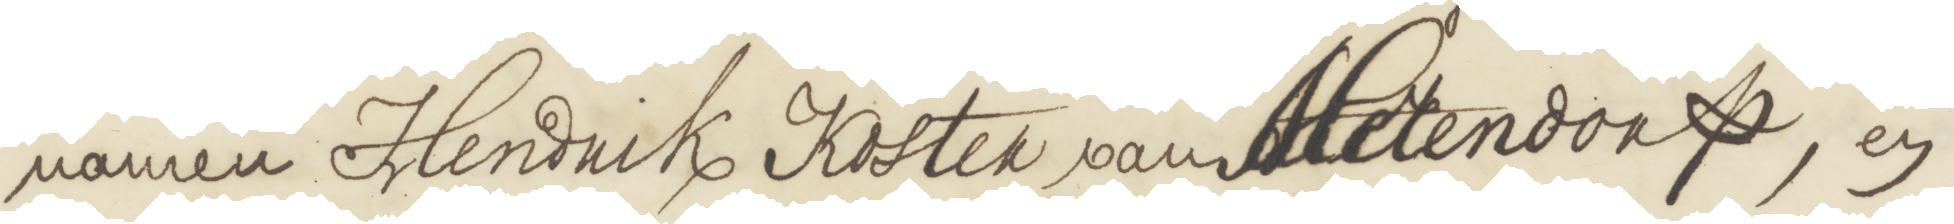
namen Hendrik Koster, van Metendorp, en
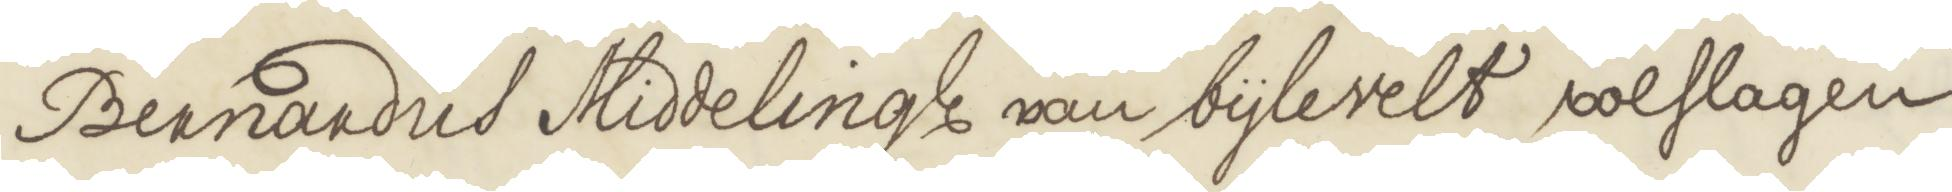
Bernardus Middelingh van bijlevelt volslagen
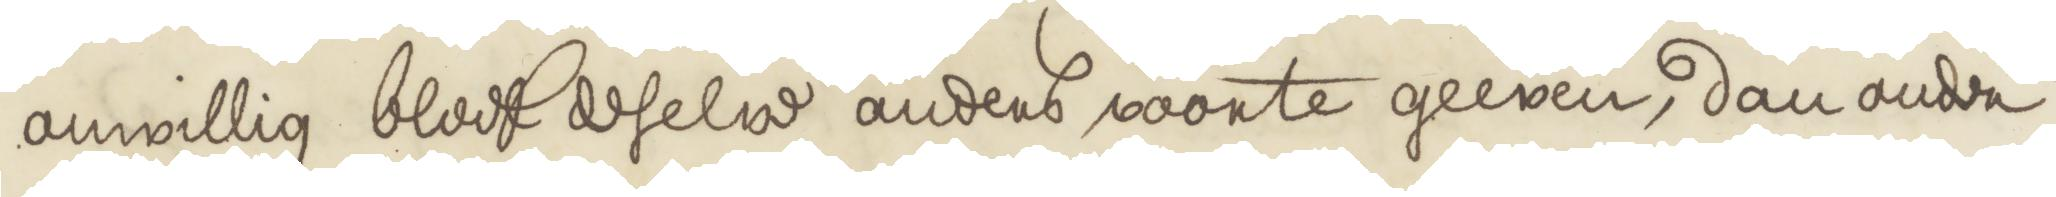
onwillig bleef deselve anders voorte geeven, dan onder
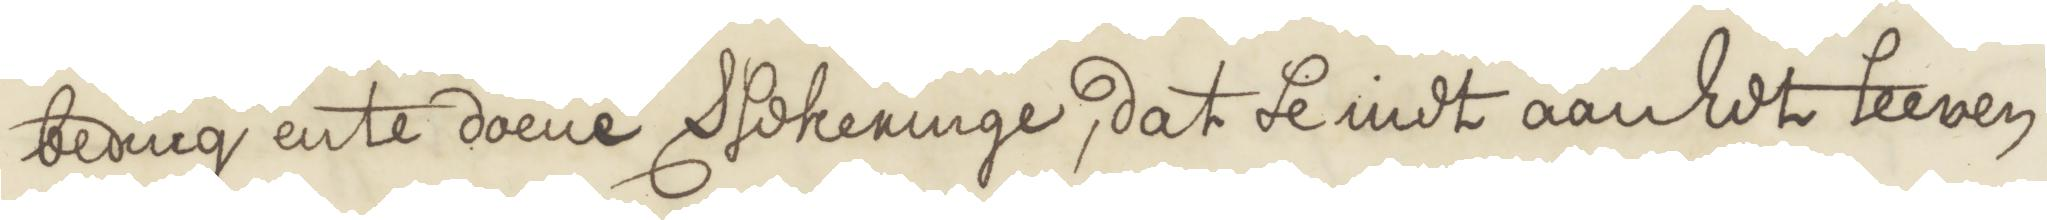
beding en te doene versekeringe, dat se niet aan het leeven
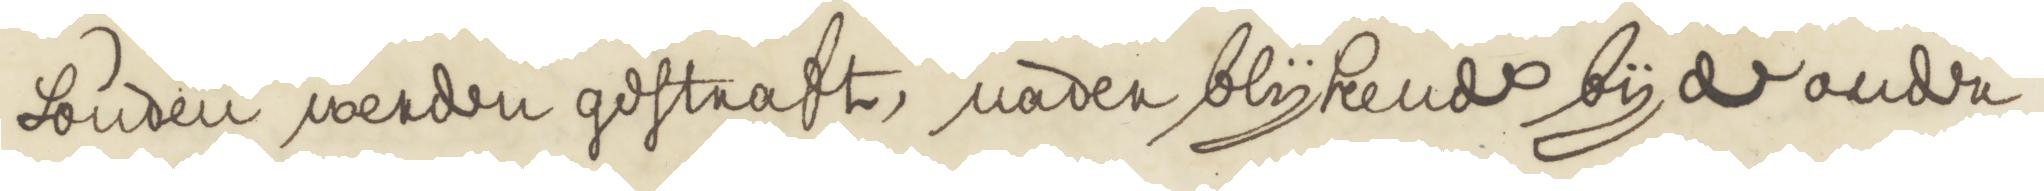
souden werden gestraft, nader blijkende bij de onder
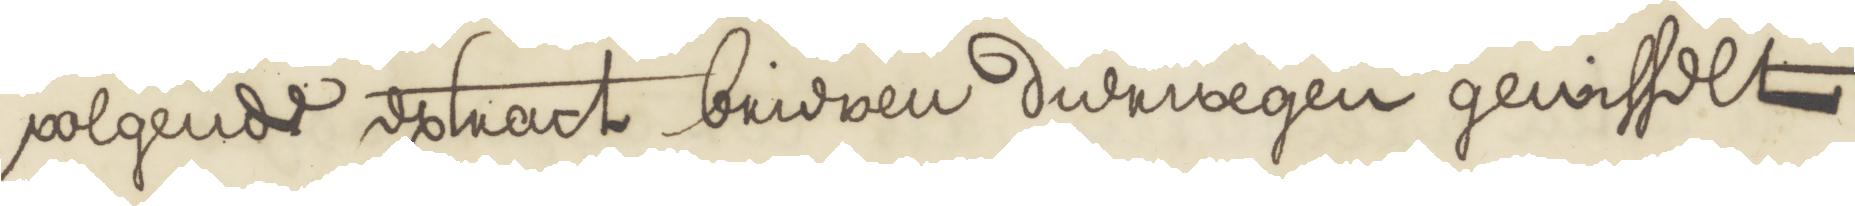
volgende extract brieven dierwegen gewisselt
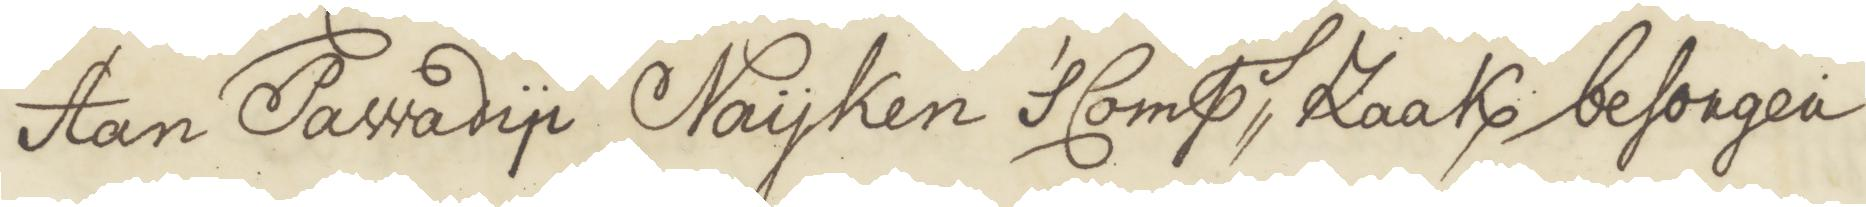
Aan Pawadiji Naijken 'sComp„s zaak besorgen
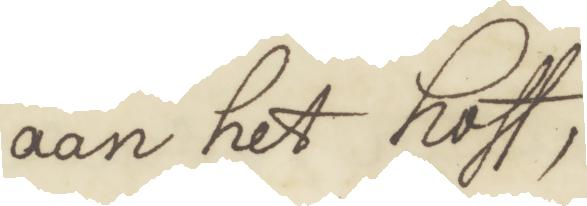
aan het hoff,
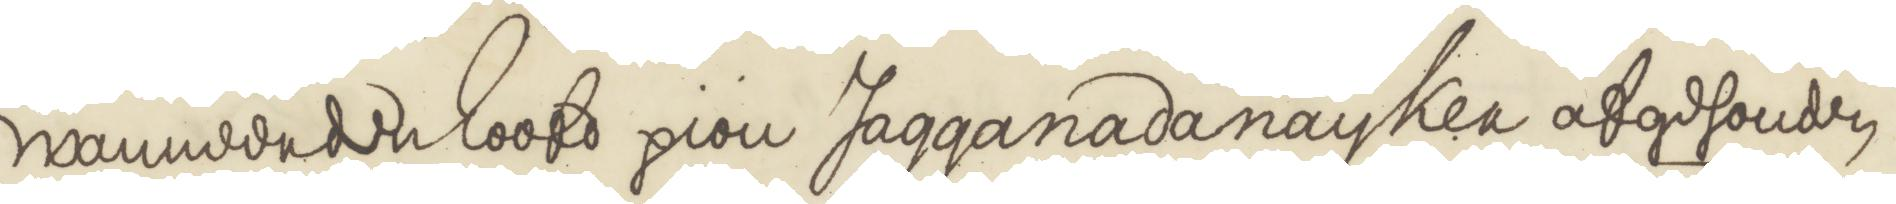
wanneer den hoofd pion Jagganadanaijker afgesonden
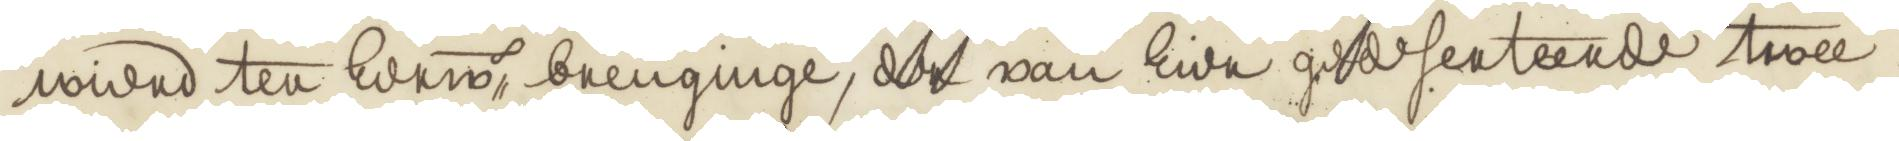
wierd ter herw„s brenginge, der van hier gedeserteerde twee
